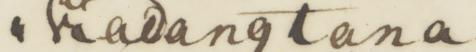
„kadangtana
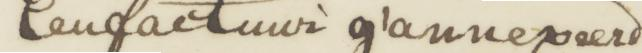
Een factuur g’annexeerd
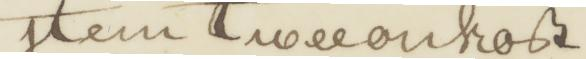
jtem twee onkost
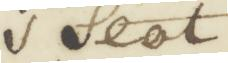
'T slot
